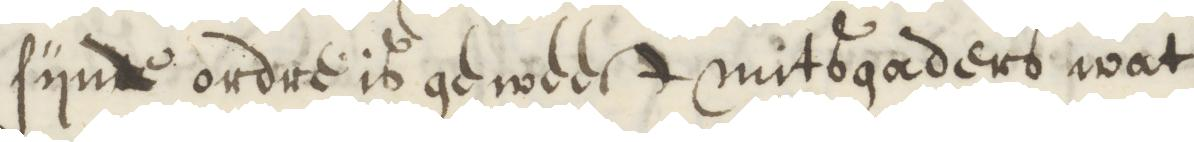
sijnde ordre is geweest mitsgaders wat
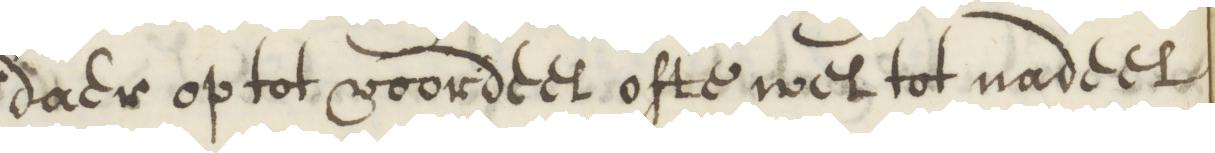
daer op tot voordeel ofte wel tot nadeel
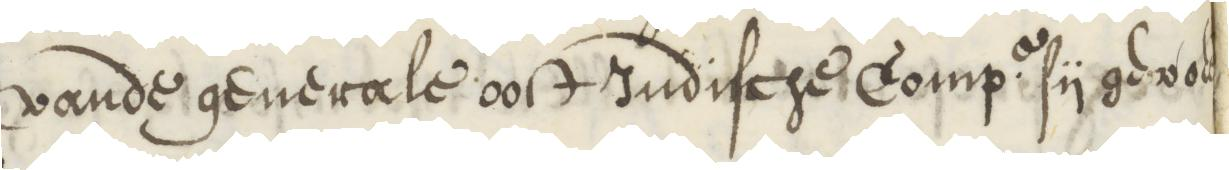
vande generale oost Indische Comp:e sij gevoe
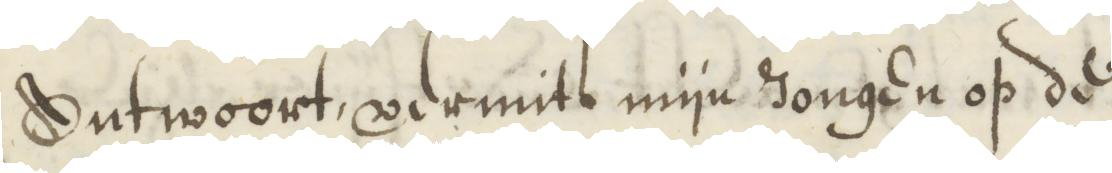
Antwoort, vermits mijn Iongen op de
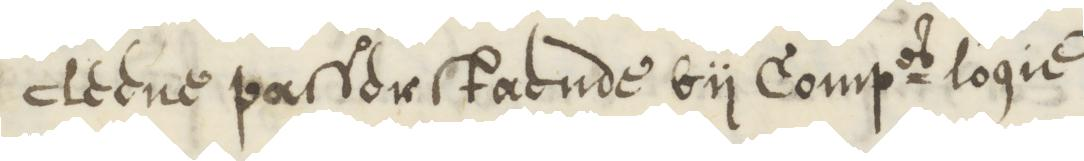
cleene passer staende bij Comp=es logie
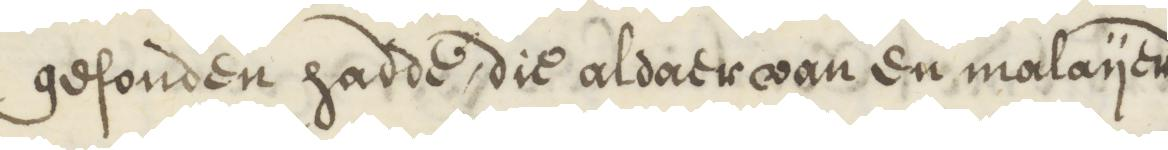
gesonden hadde, die aldaer van en malaijer
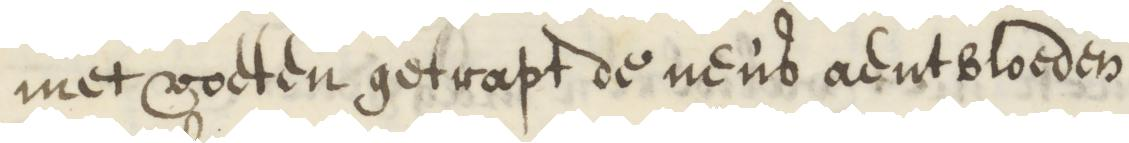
met voeten getrapt de neus aent bloeden
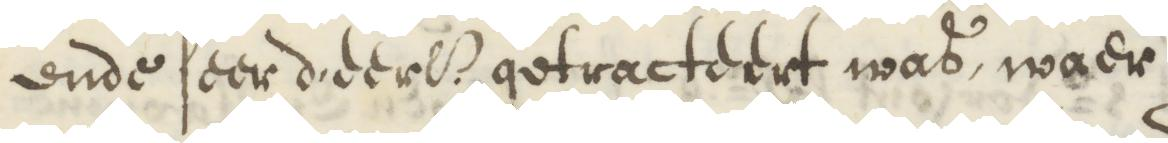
ende seer d'eerlijk getracteert was, waer
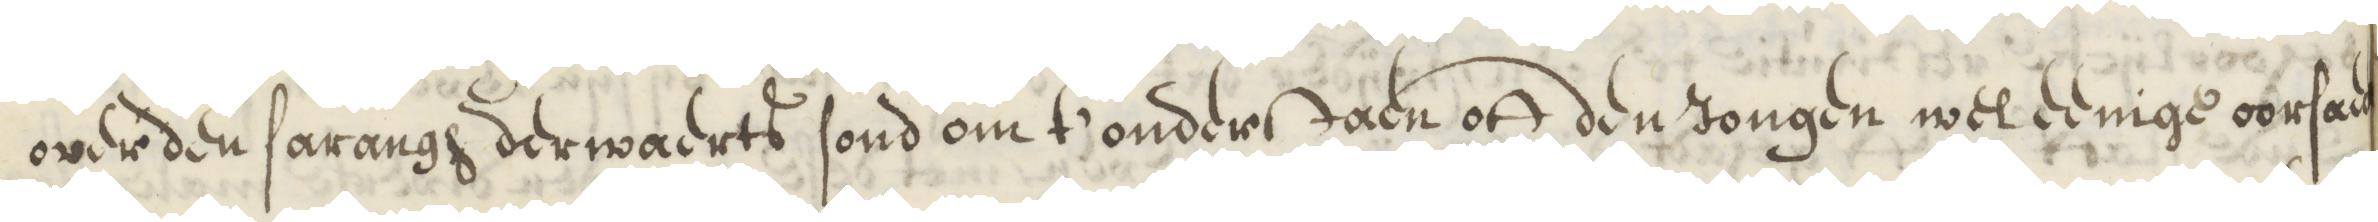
over den sarangh derwaerts sond om t' onderstaen oft den Iongen wel eenige oorsae
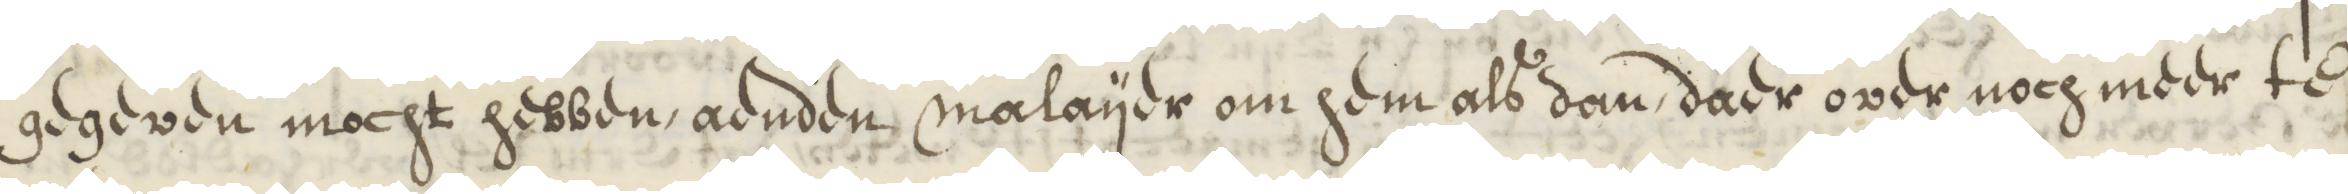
gegeven mocht hebben, aenden malaijer om hem als dan, daer over noch meer te
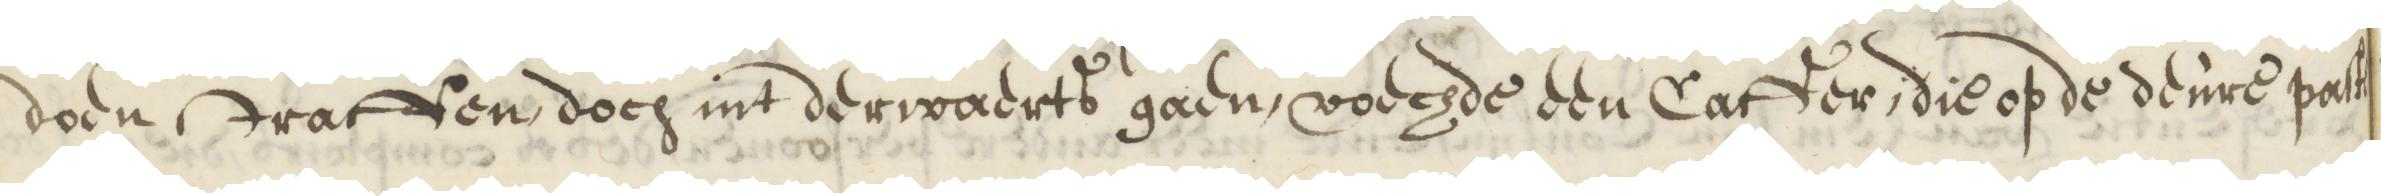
doen straffen, doch int derwaerts gaen, voechde een Caffer, die op de deure past
